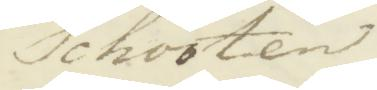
Schooten
